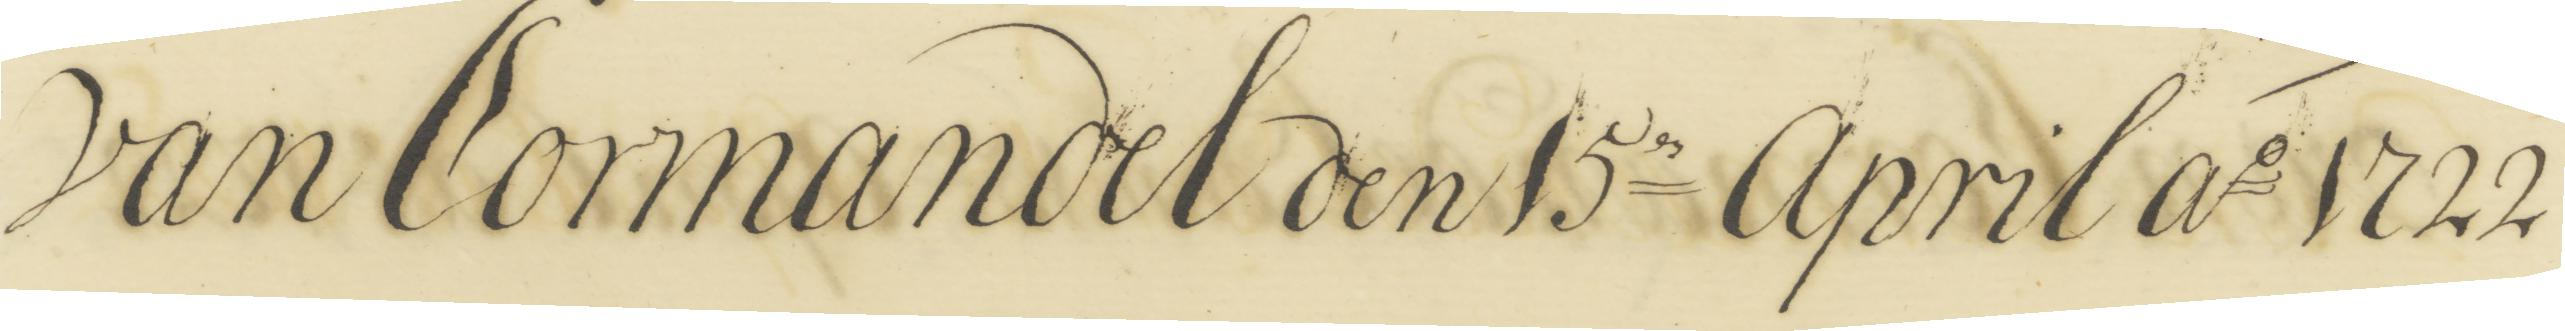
Van Cormandel den 15=en April A=o 1722
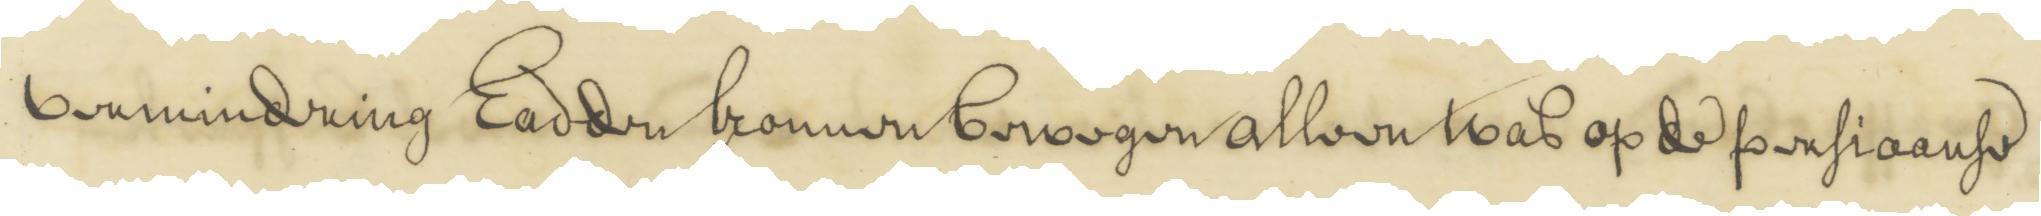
vermindering hadden konnen bewegen alleen was op de persiaanse
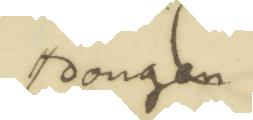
dongen
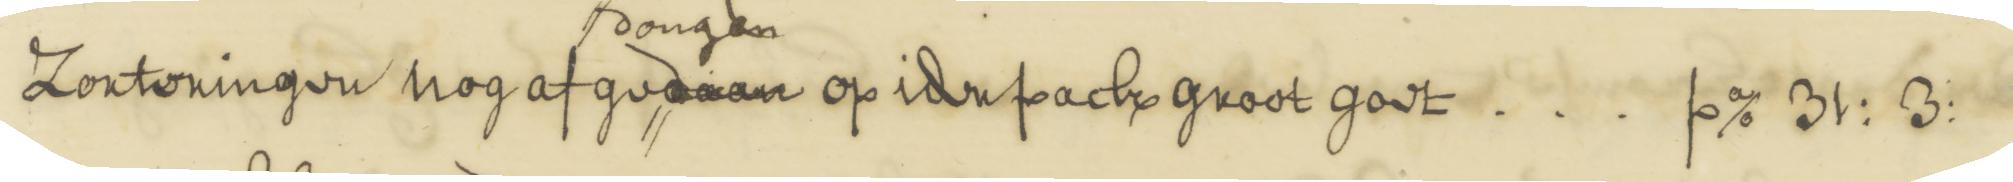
Zorteringen nog afge„daan op ider pack groot goet - - - p a/o 31: 3:
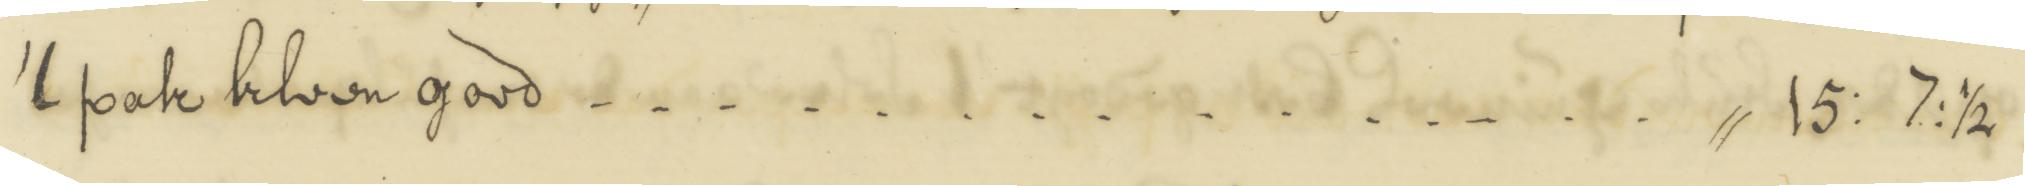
’t pak kleer goed - - - - - - - - - - - - - - - „ 15: 7: ½
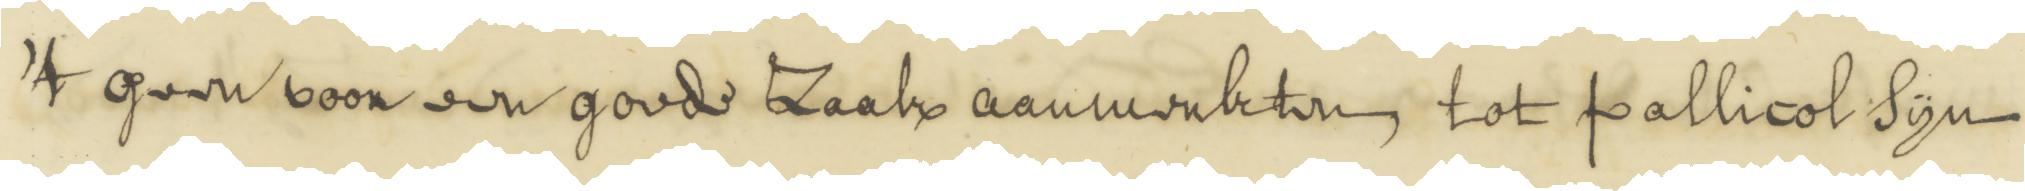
’t geen voor een goede zaak aanmerkten, tot pallicol sijn
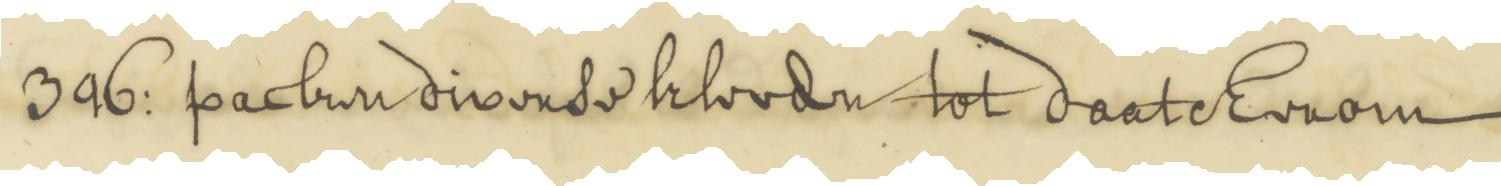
346: packen diverse kleeden tot daatcherom
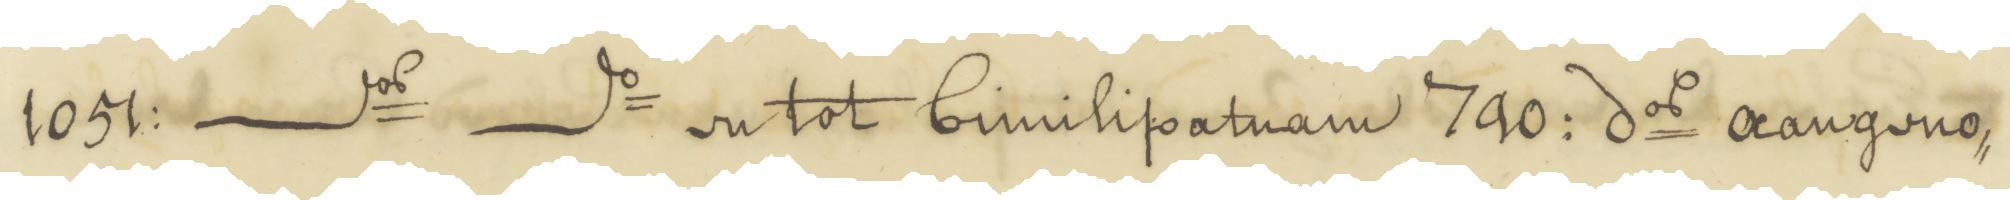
1051: D=os D=o en tot bimilipatnam 740: d=os aangeno„
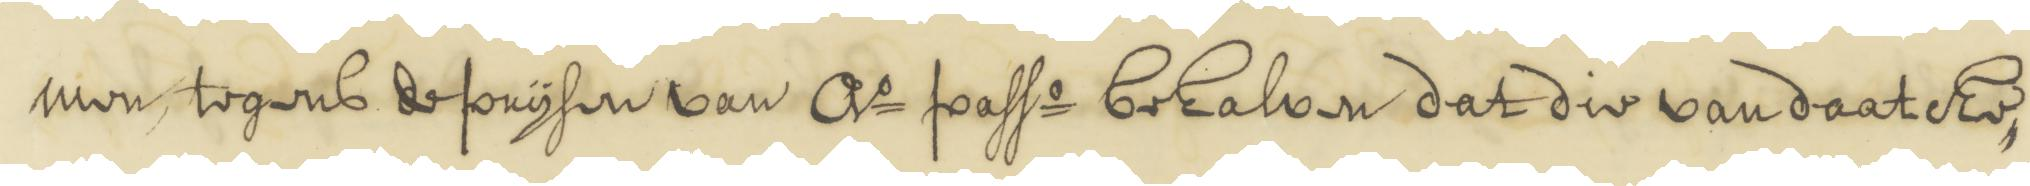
men, tegens de prijsen van A=o pass=o behalven dat die van daatche„
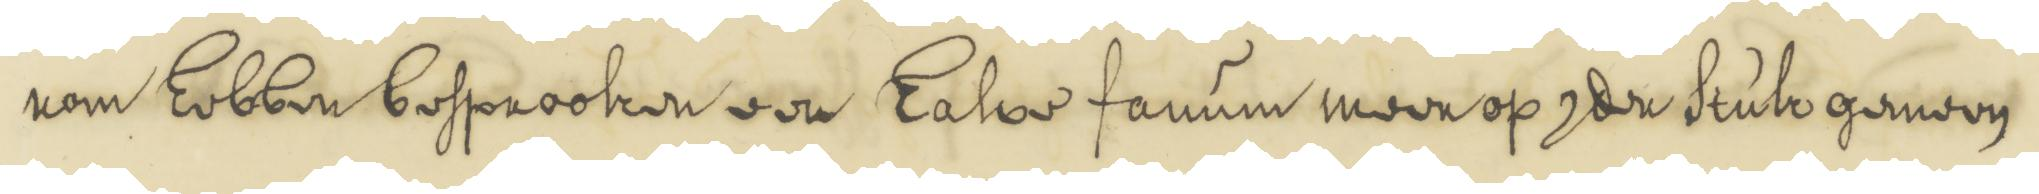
rom hebben besprooken een halve fanum meer op jder stuk gemeen
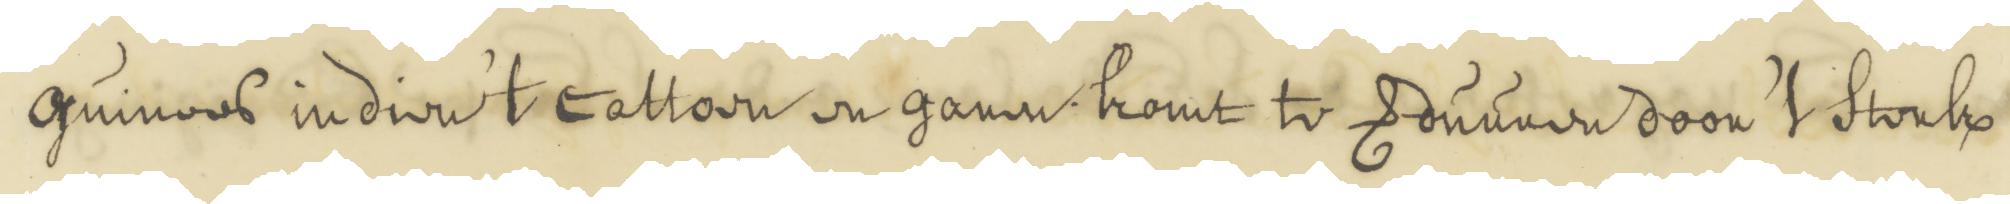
Guinees in dien ’t cattoen en garen komt te verduuren door ’t sterk
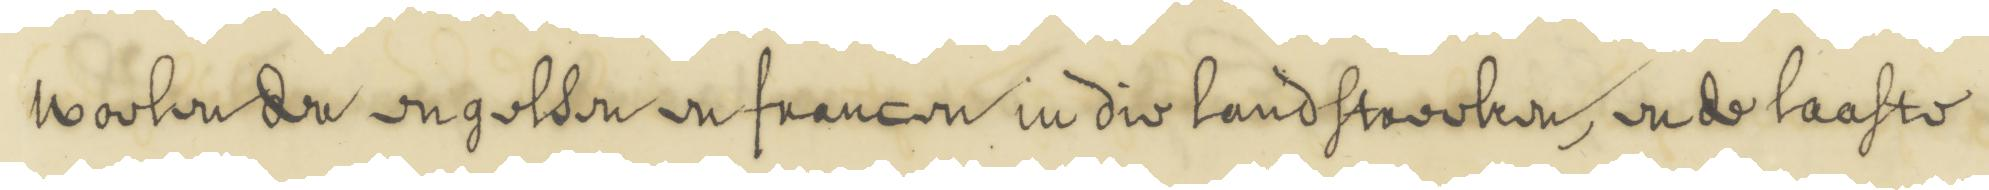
woelen der engelsen en francen in die landstreeken, en de laaste
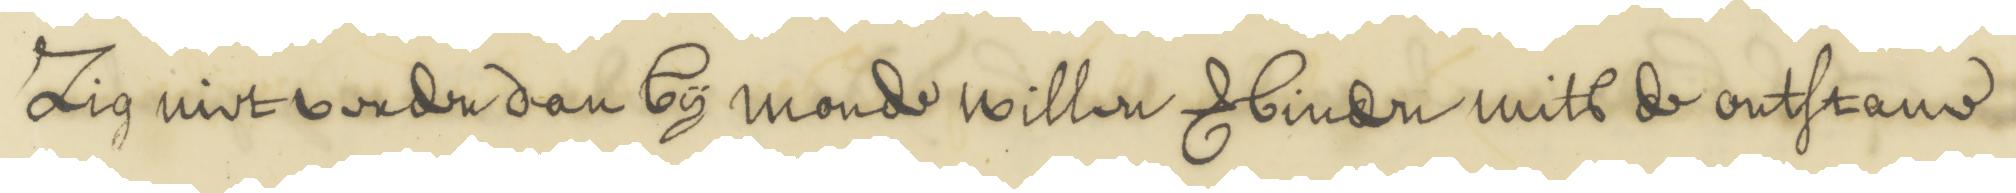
zig niet verder dan bij monde willen verbinden mits de ontstane
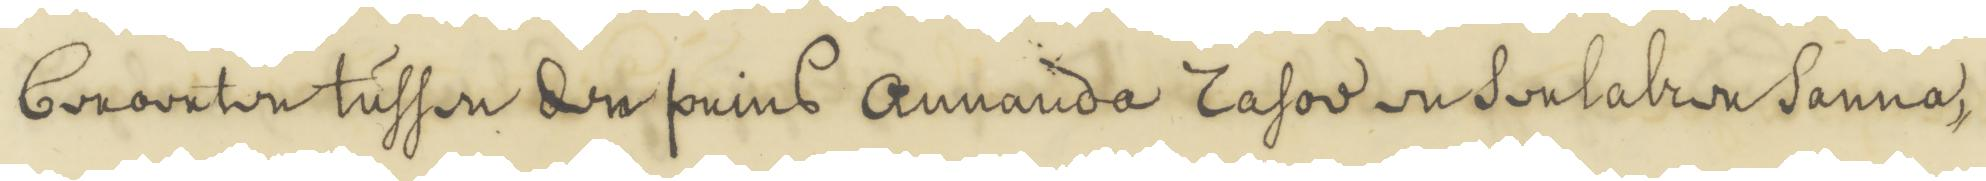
beroerten tussen den prins Annanda Rasoe en serlaker sanna„
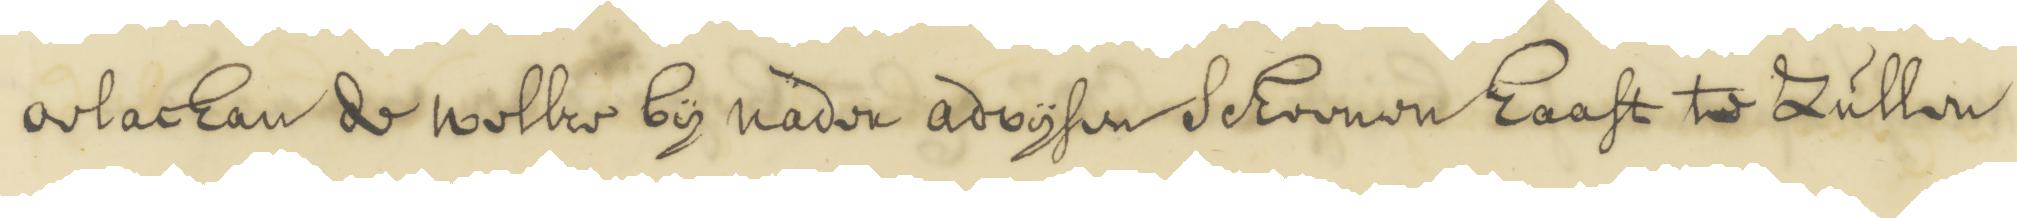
oelachan de welke bij nader advijsen scheenen haast te zullen
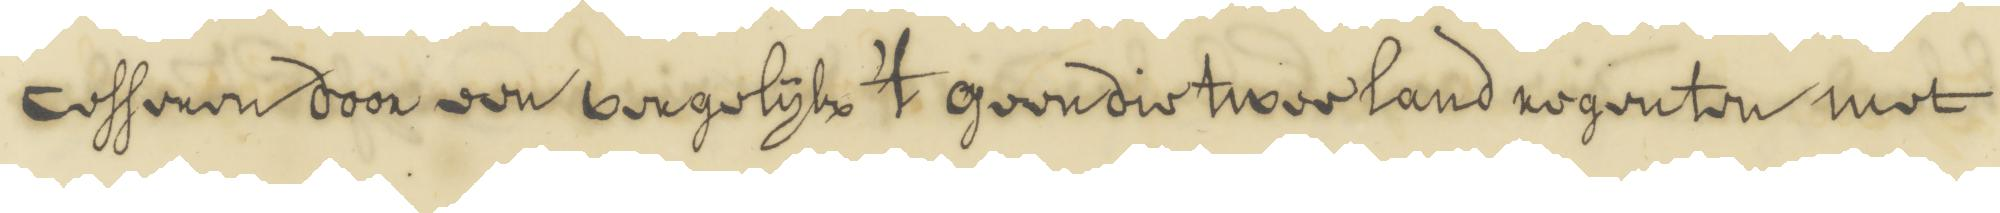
cesseren door een vergelijk ’t geen die twee land regenten met
